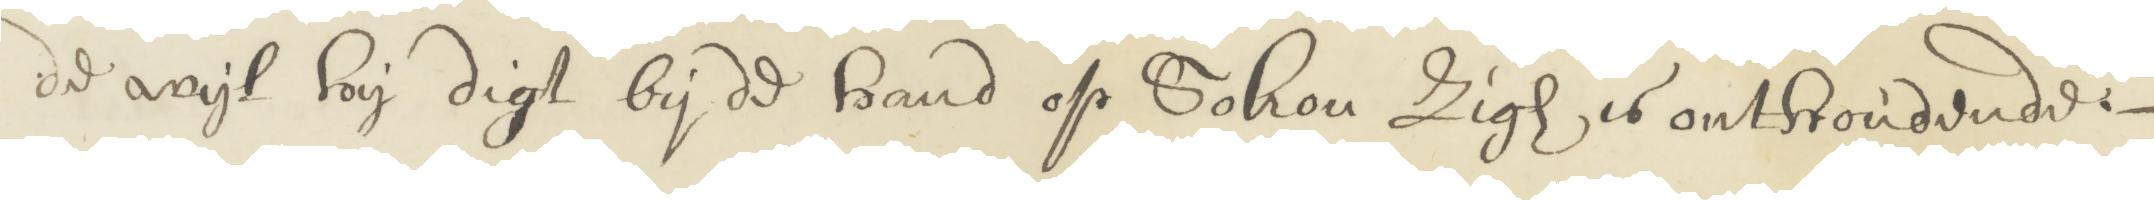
de wijl hij digt bij de hand op Sokon Zigh is onthoudende. —
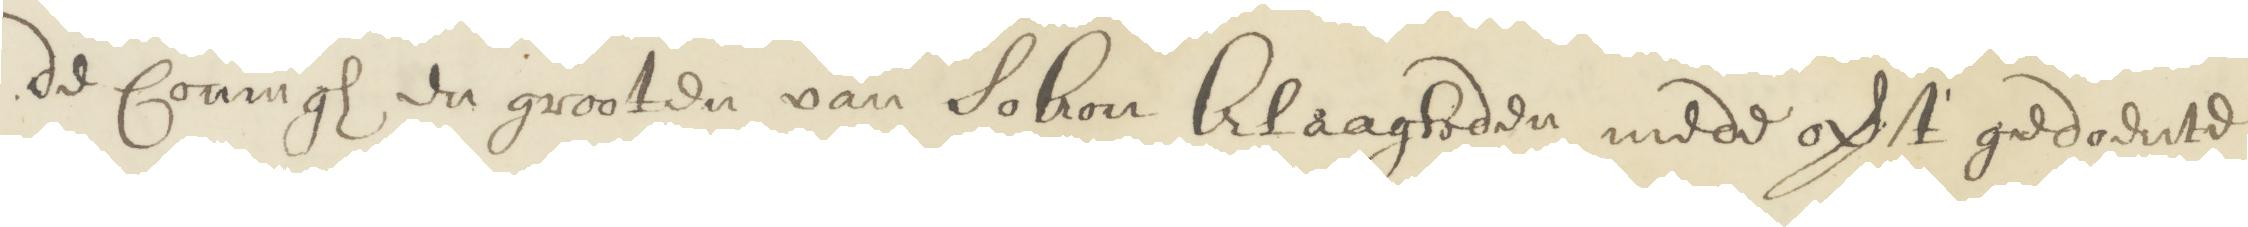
de Coningh en grooten van Sokon klaaghden mede over t' gedoente
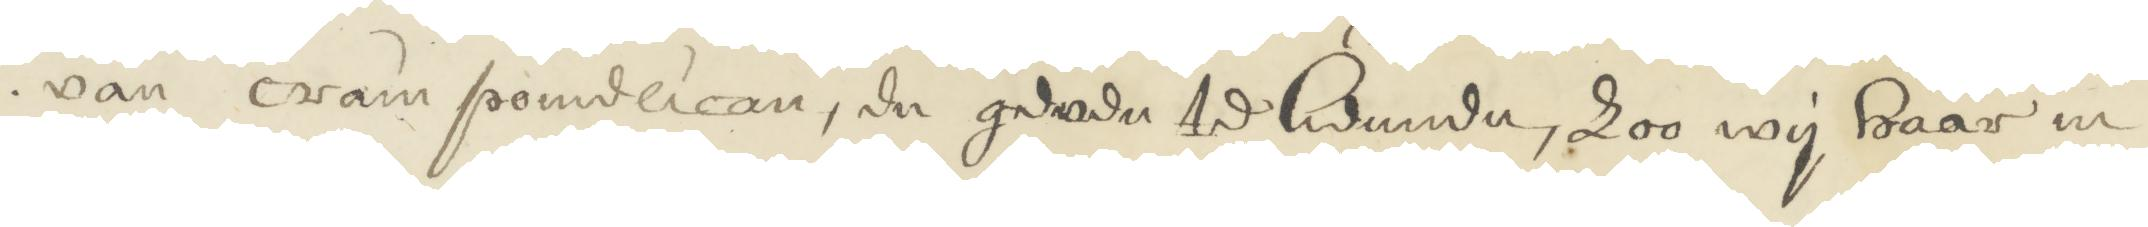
van crain pomelican, en geven te kennen, Zoo wij haar in
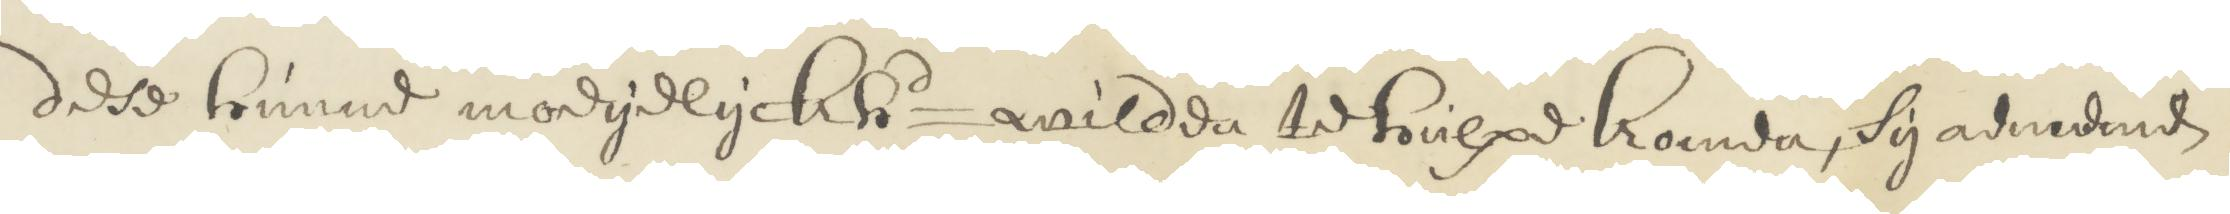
dese hunne moeijelijckh=d wilden te hulpe komen, sij aennemen
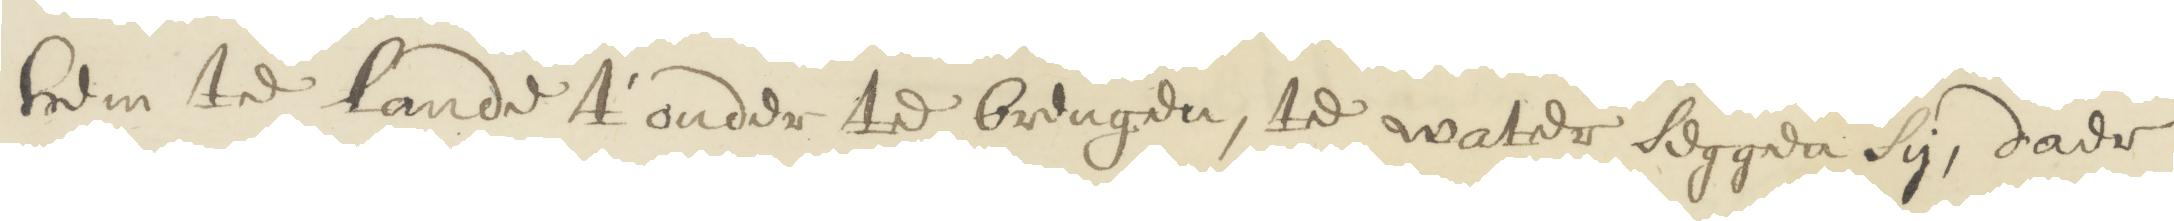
hem te lande t' onder te brengen, te water seggen sij, daer
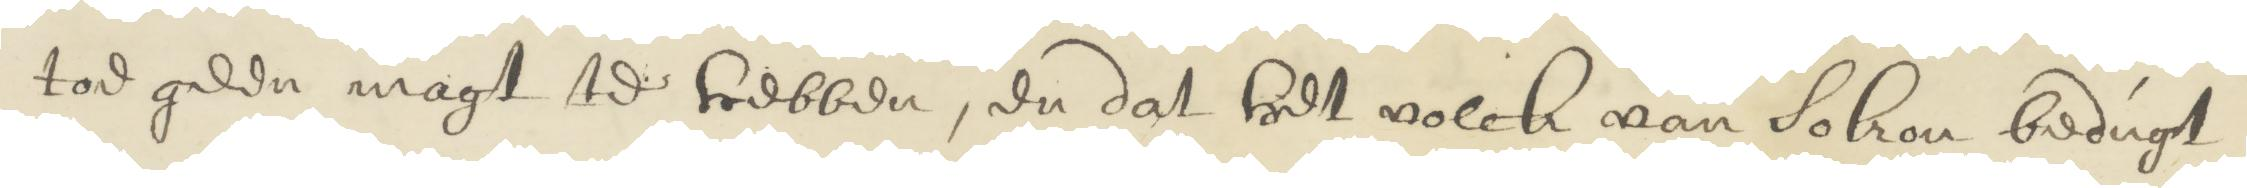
toe geen magt te hebben, en dat het volck van Sokon bedugt
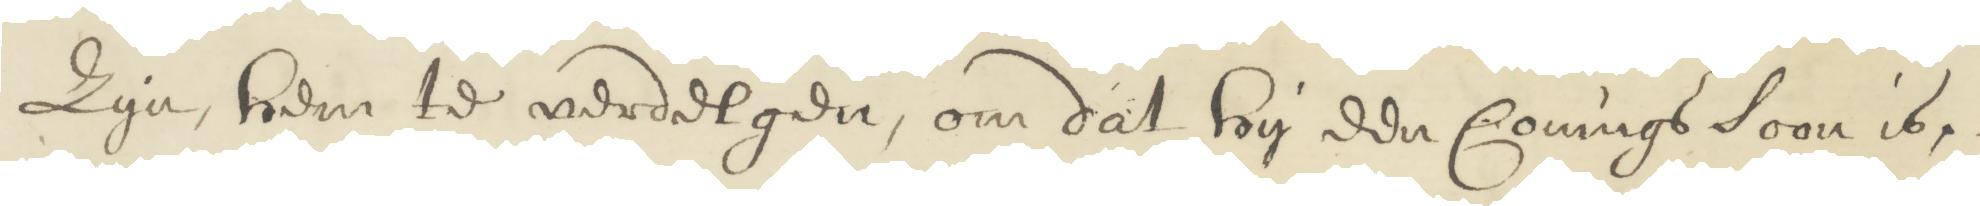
Zijn, hem te verdelgen, om dat hij een Conings Soon is,
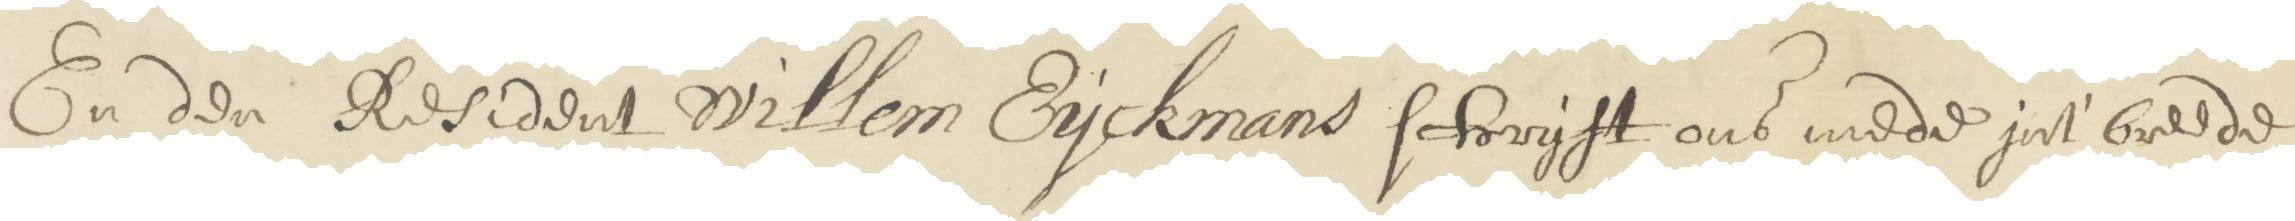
En den Resident Willem Eijckmans schrijft ons mede jnt' breede
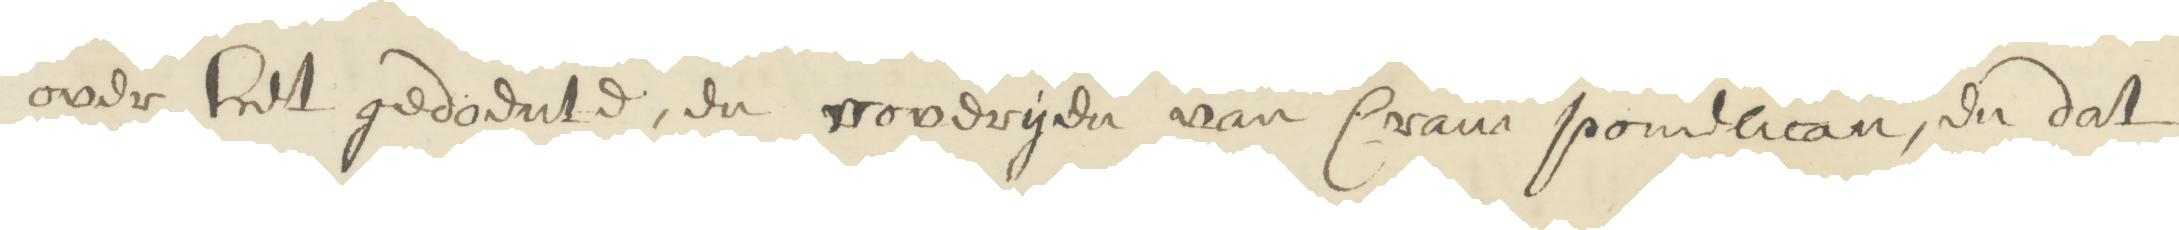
over het gedoente, en rooverijen van Crain pomelican, en dat
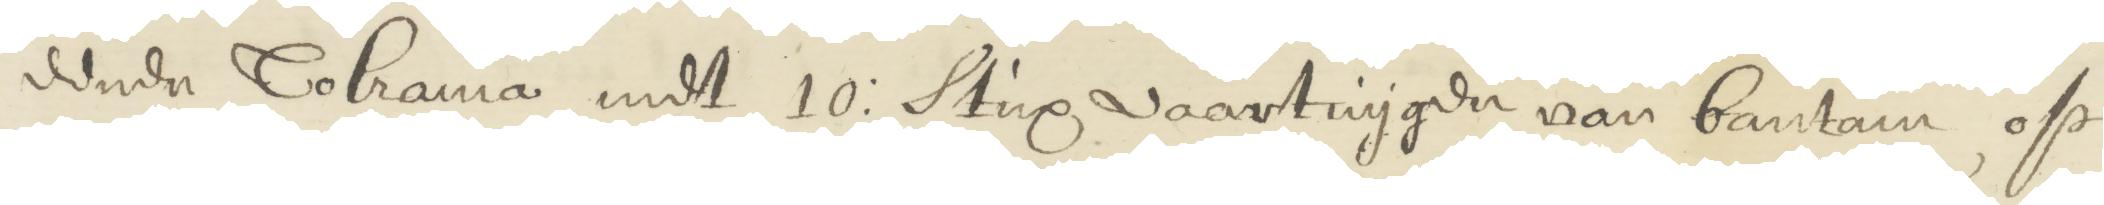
eenen Tokama met 10: Stux vaartuijgen van bantam op
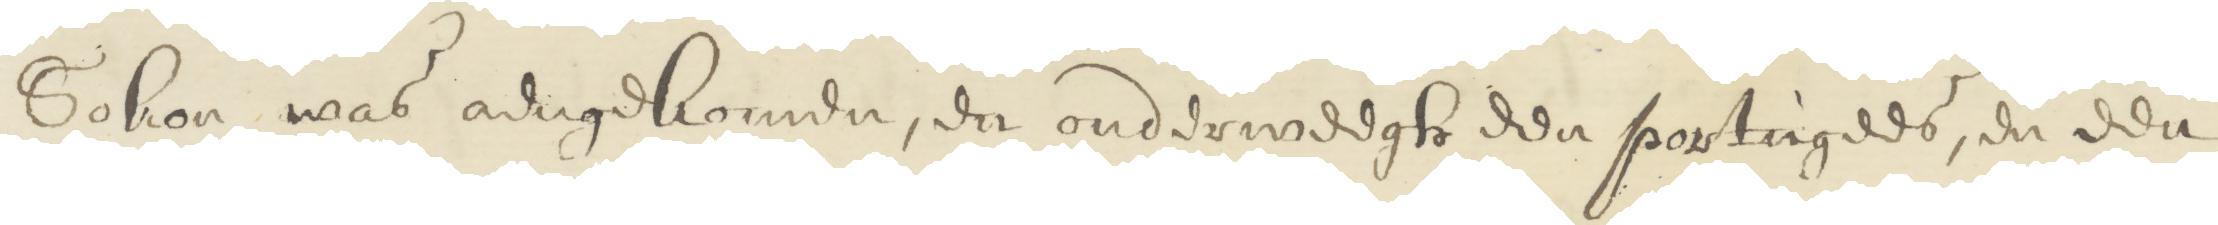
Sokon was aengekomen, en onderweegh een portugees, en een
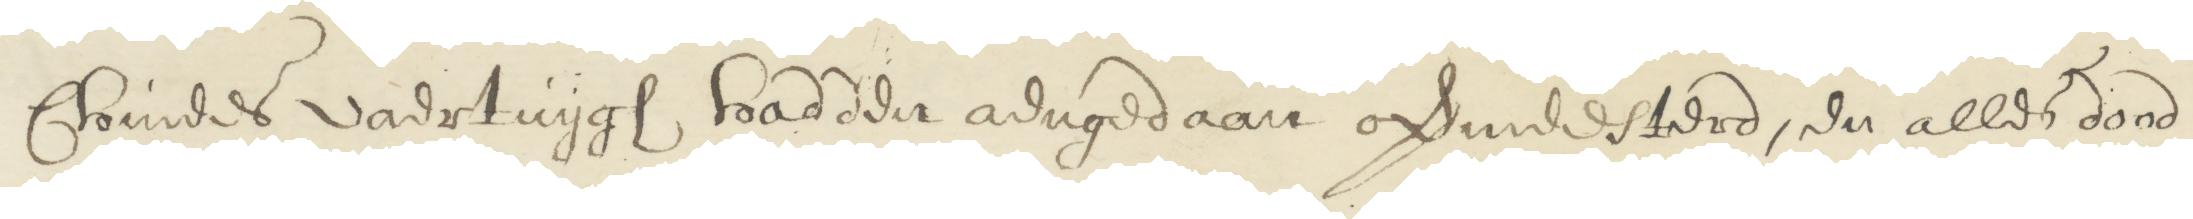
Chinees vaertuijgh hadden aengedaan overmeesterd, en alles dood
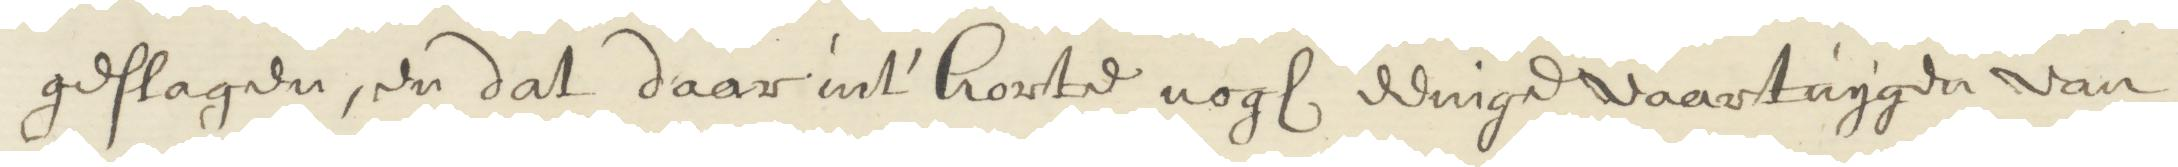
geslagen, en dat daar int' korte nogh eenige vaartuijgen van
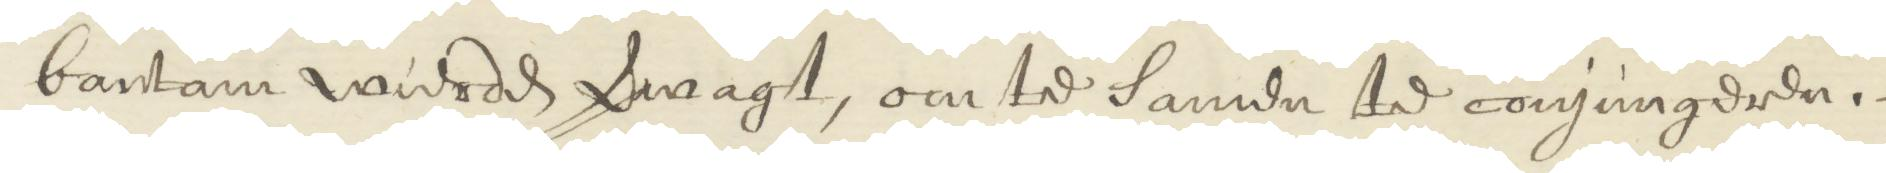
bantam wierden verwagt, om te samen te conjungeren.
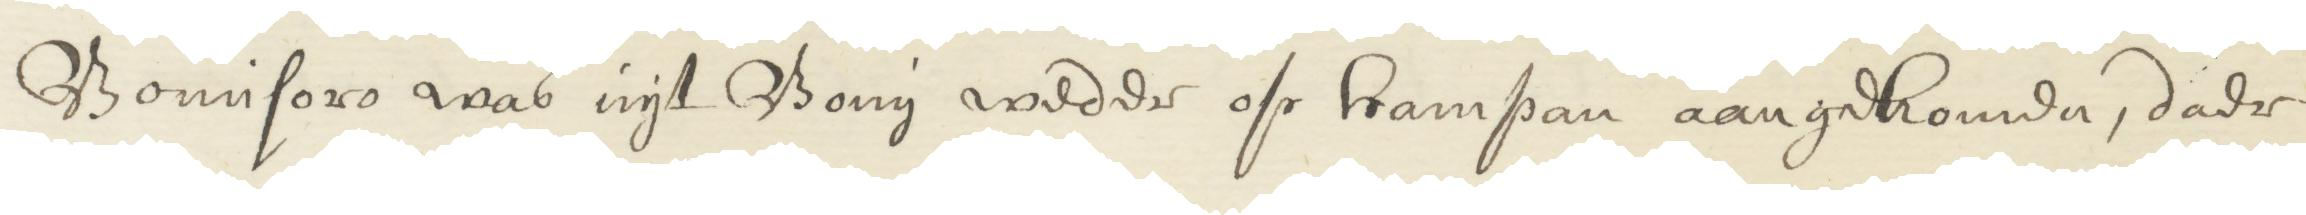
Bomisoro was uijt Bonij weder op hampan aangekomen, daer
